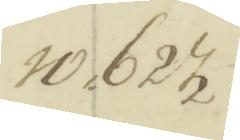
10„62½
